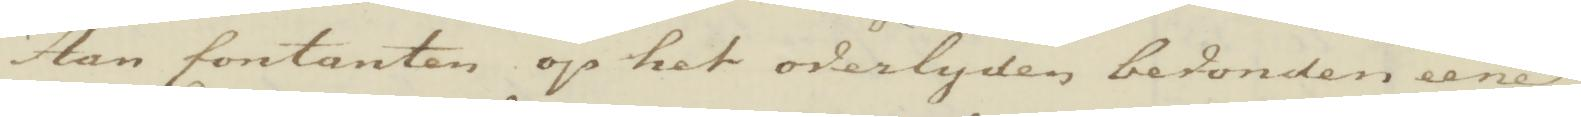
Aan Contanten op het overlyden bevonden eene
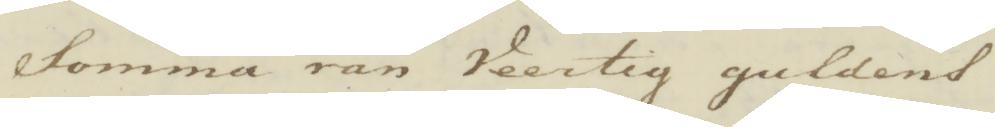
Somma van Veertig guldens
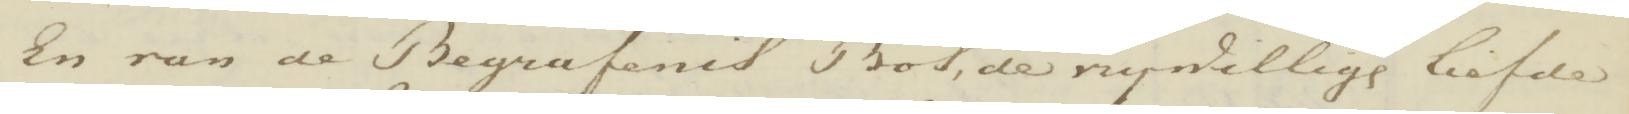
En van de Begrafenis Bos, de vrywillige liefde
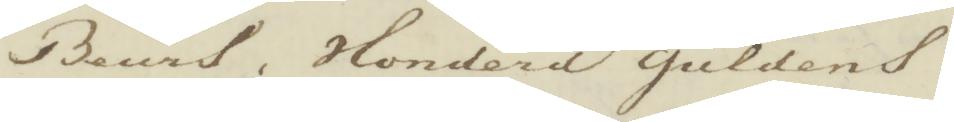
Beurs, Honderd guldens
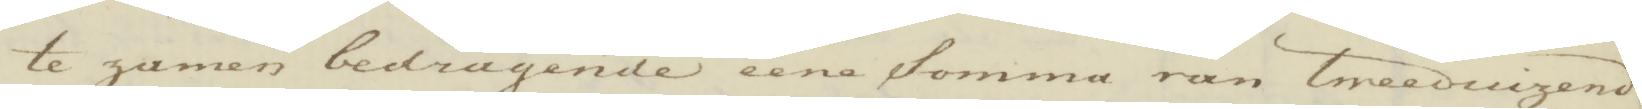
te zamen bedragende eene Somma van twee duizend
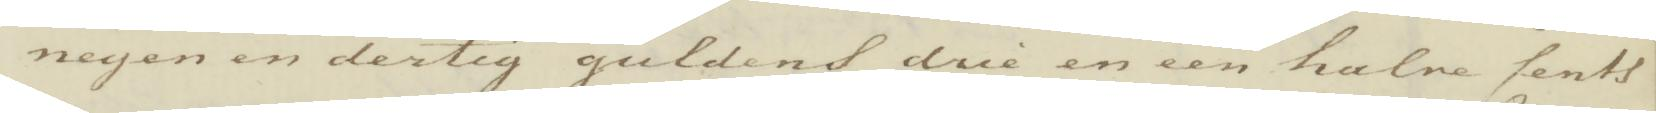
negen en dertig guldens drie en een halve Cents
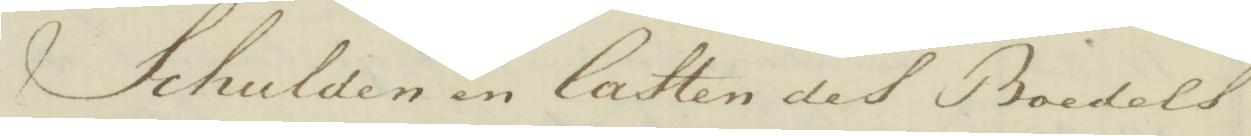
Schulden en lasten des Boedels
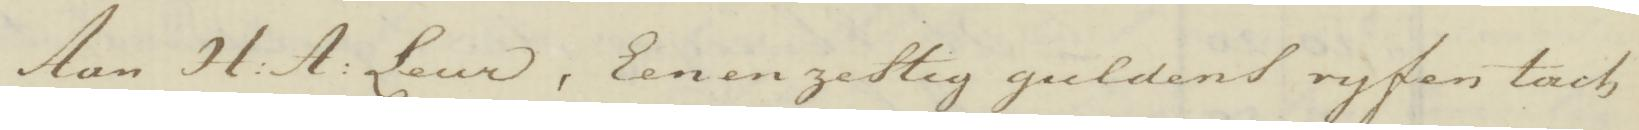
Aan H: A: Leur, Een en zestig guldens vyfen tach
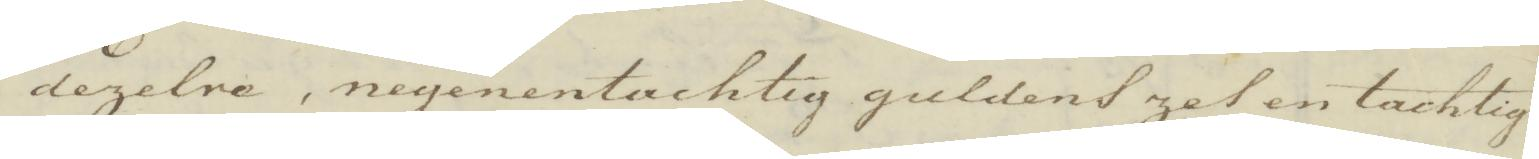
dezelve, negen en tachtig guldens zes en tachtig
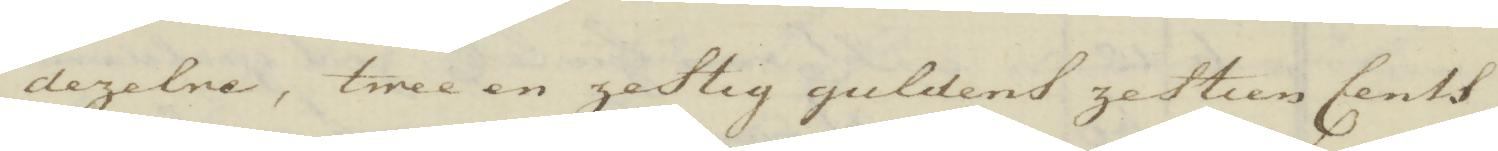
dezelve, twee en zestig guldens zestien Cents
